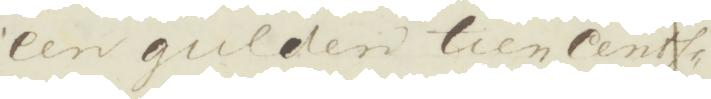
een gulden tien cents„
